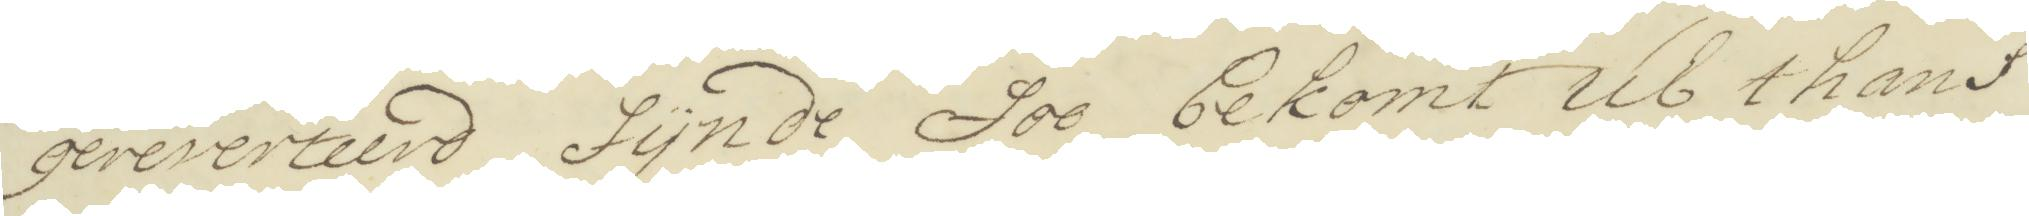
gereverteerd sijnde soo bekomt uE thans
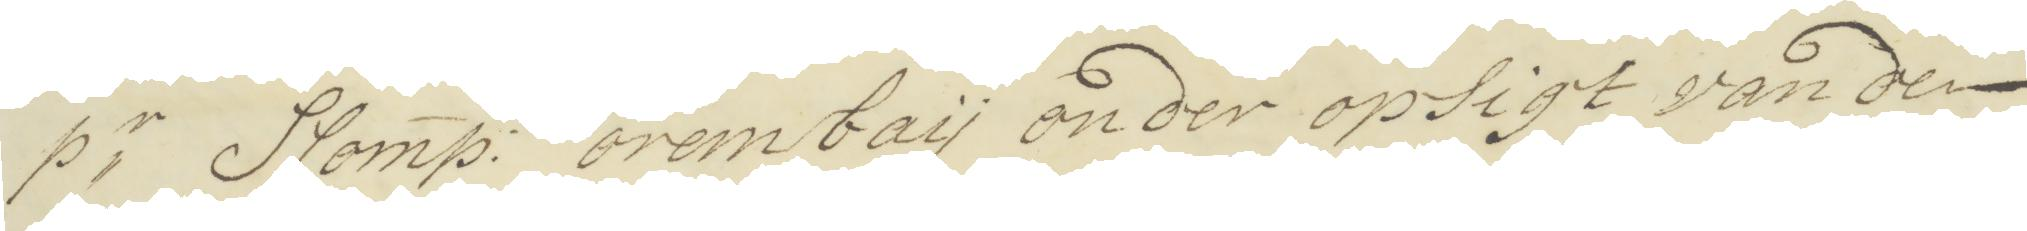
p„r SComp:s orembaij onder opsigt van den
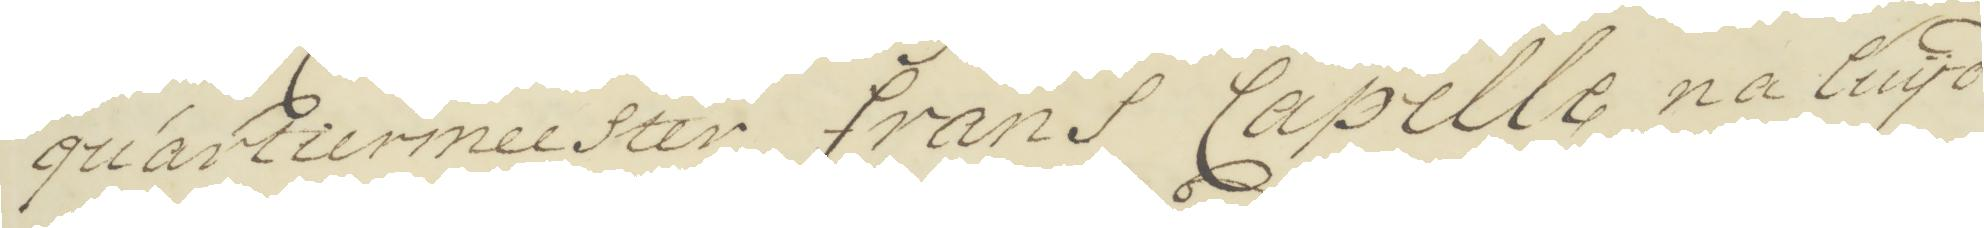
quartiermeester Frans Capelle na luijd
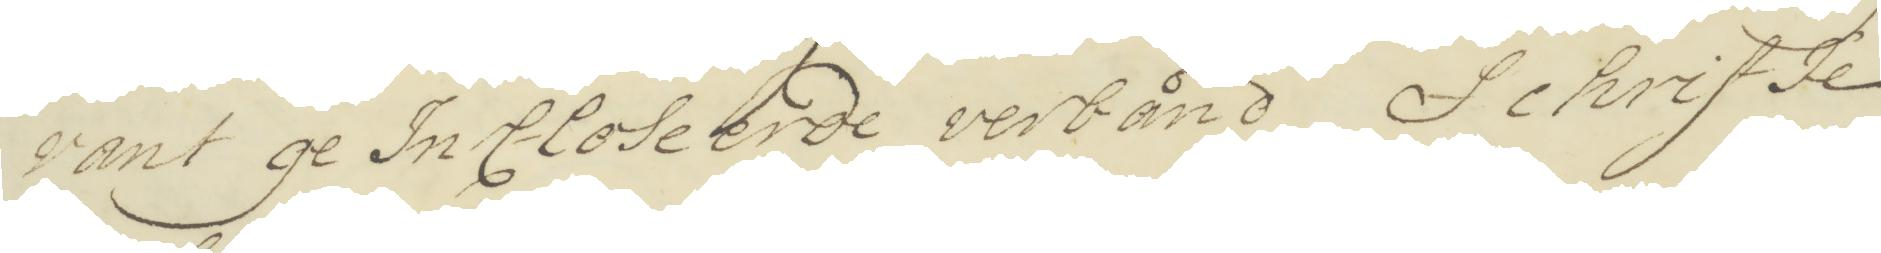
vant ge Incloseerde verband schrifte
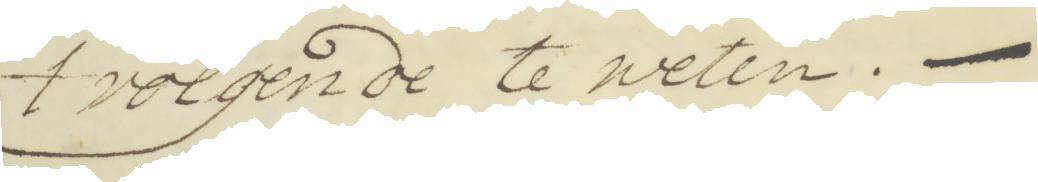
t volgende te weten.—
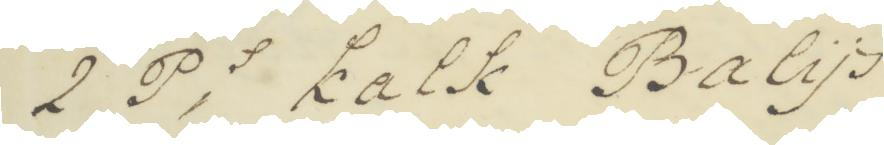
2 P„s kalk Balijs
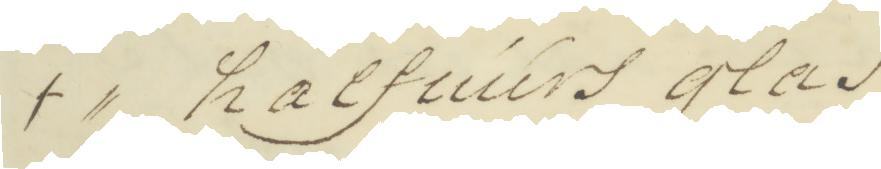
1 „ halfuurs glas
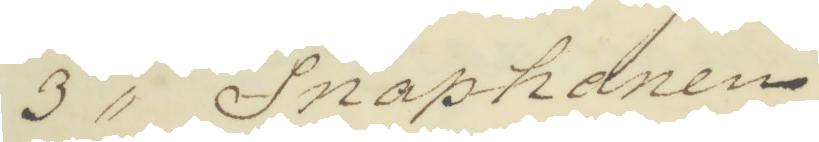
3 „ Snaphanen
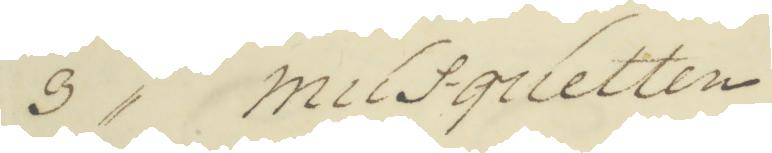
3 „ musquetten
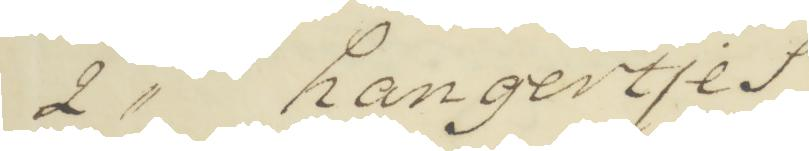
2 „ hangertjes
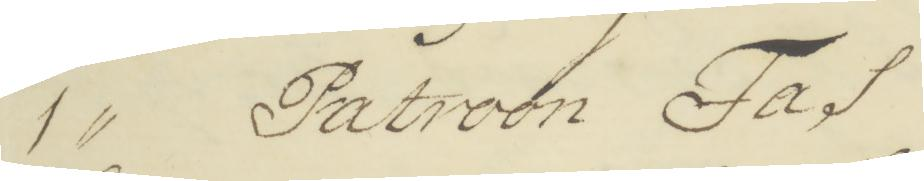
1„ Patroon Tas
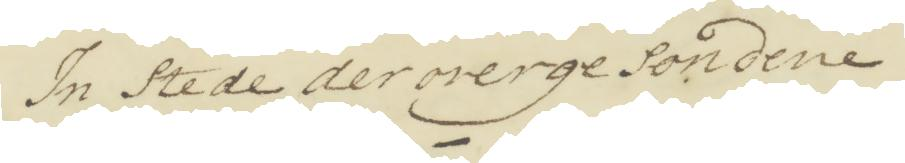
In stede der overgesondene
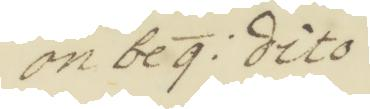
on beg: dito
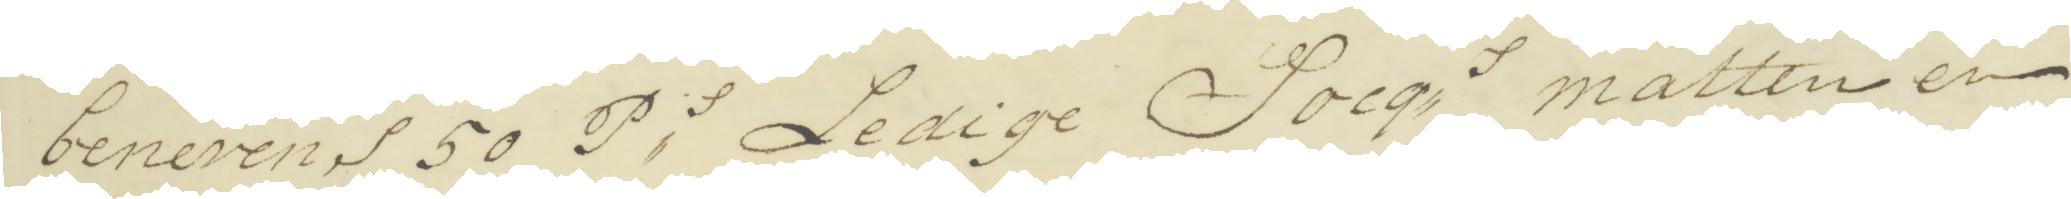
benevens 50 P„s Ledige Jocq„s matten en
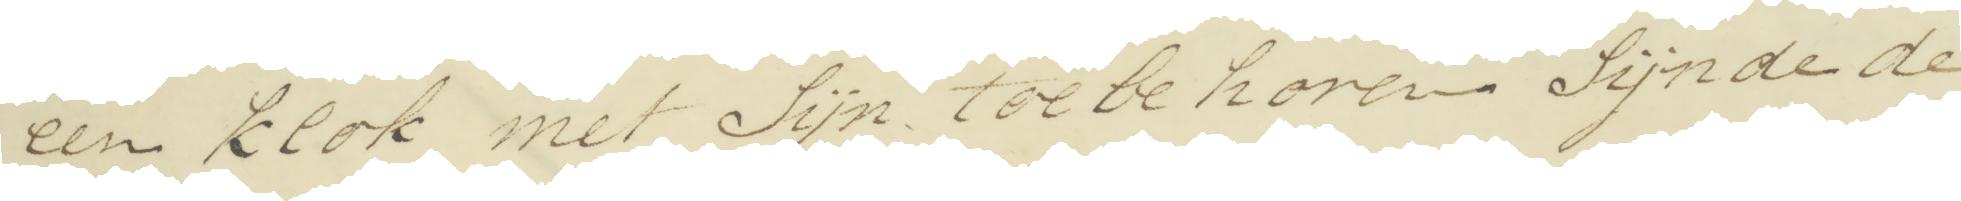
een klok met sijn toe behoren sijnde de
